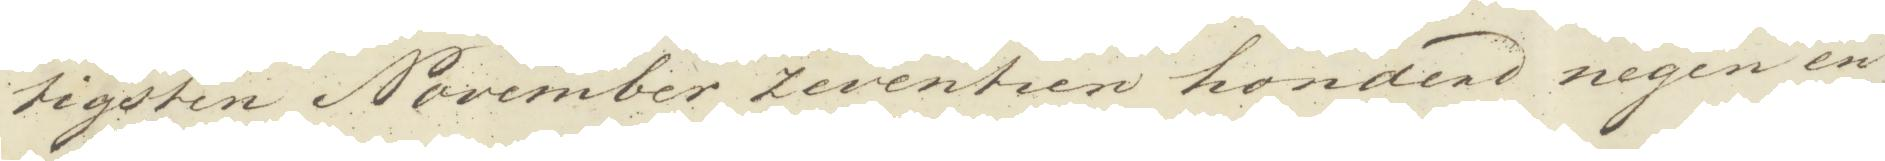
tigsten November zeventien honderd negen en
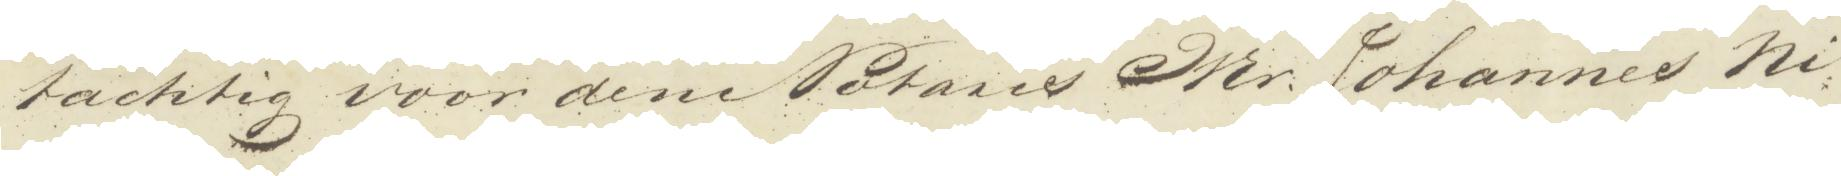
tachtig voor den Notaris Wer. Johannes Ni:
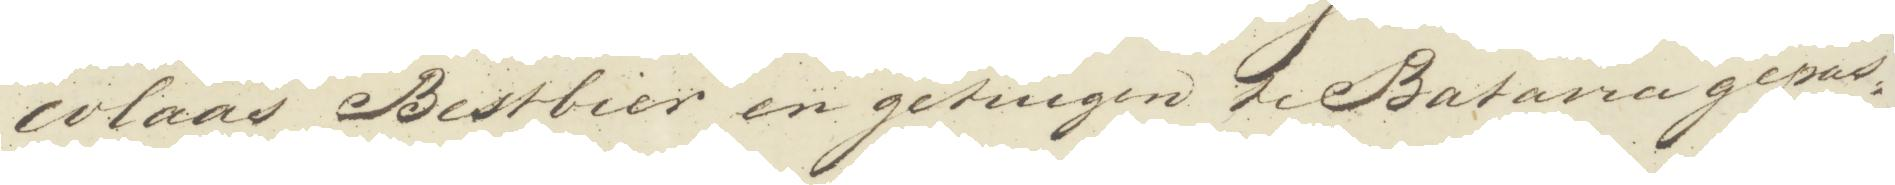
colaas Bestbier en getuigen te Batavia gepas„
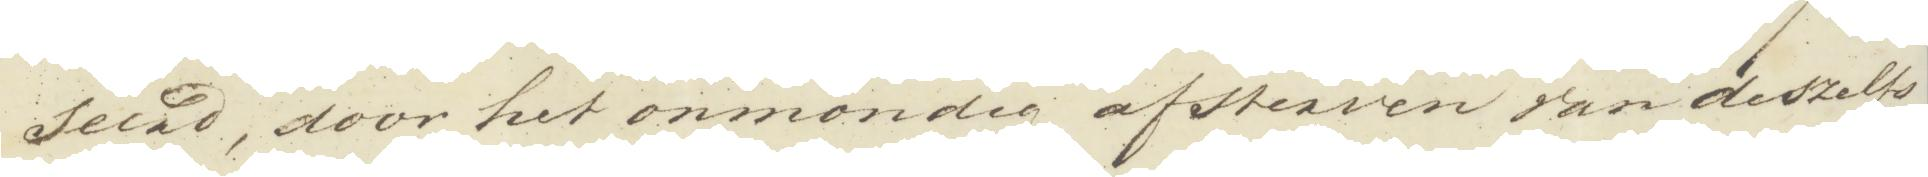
seerd, door het onmondig afsterven van deszelfs
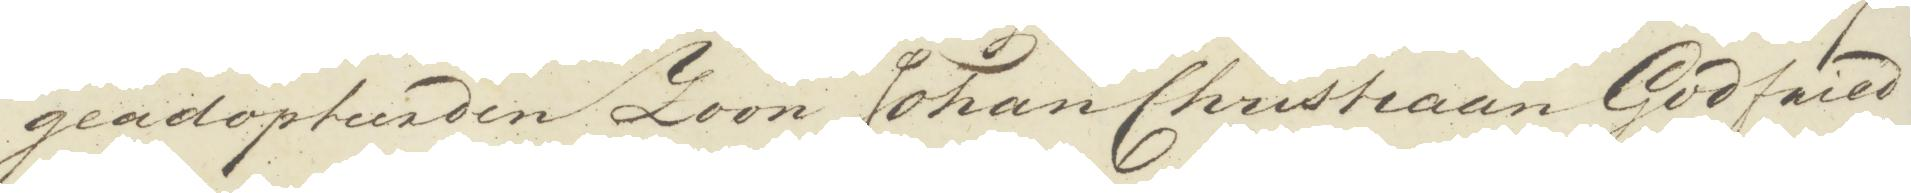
geadopteerden Zoon Johan Christiaan Godfried
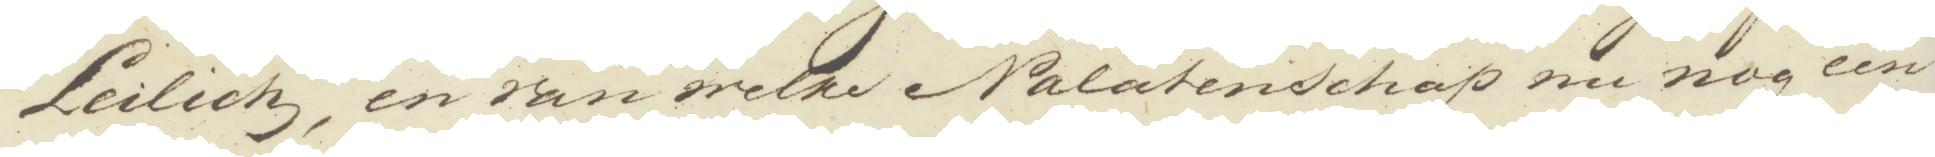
Leilich, en van welke Nalatenschap nu nog een
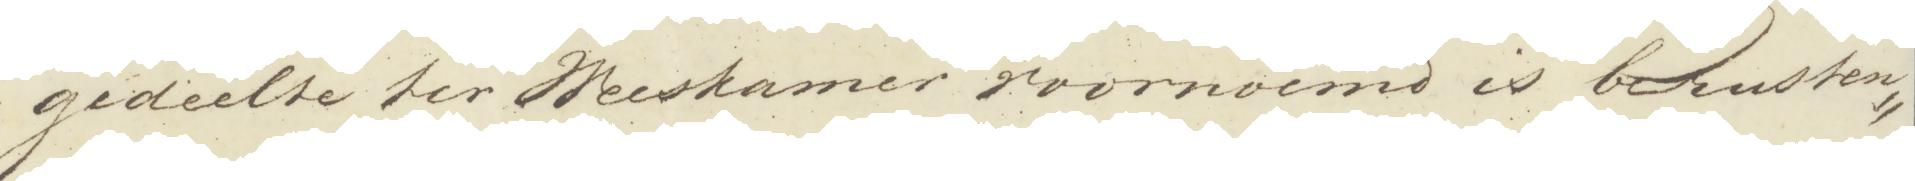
gedeelte ter Weeskamer voornoemd is berusten,
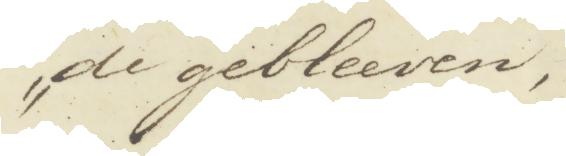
„de gebleeven,
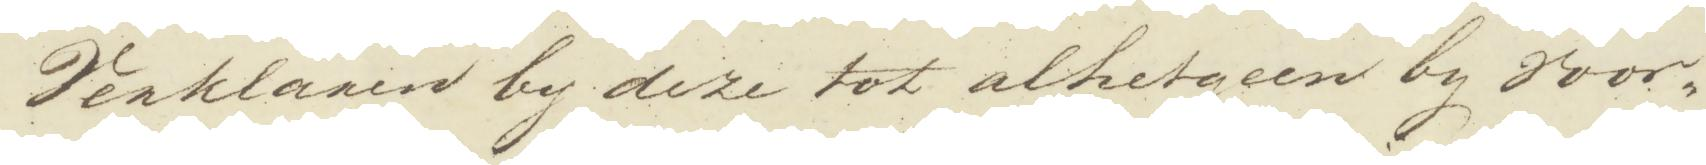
Verklaren by deze tot alhetgeen bij voor„
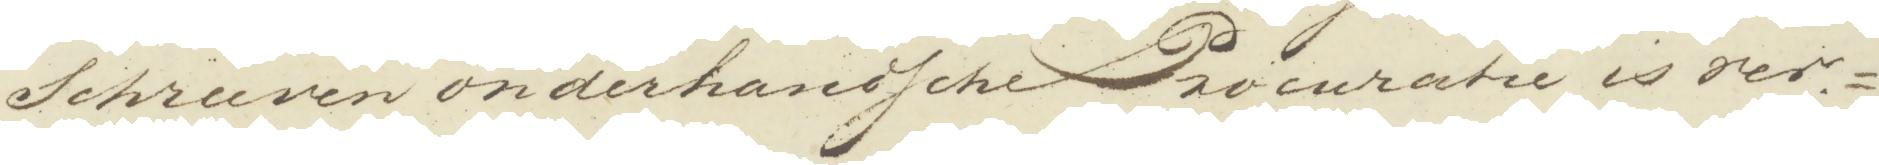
schreeven onderhandsche Procuratie is ver„=
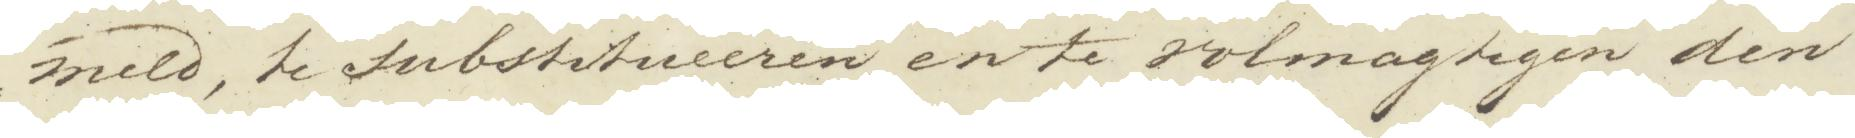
meld, te substitueeren en te volmagtigen den
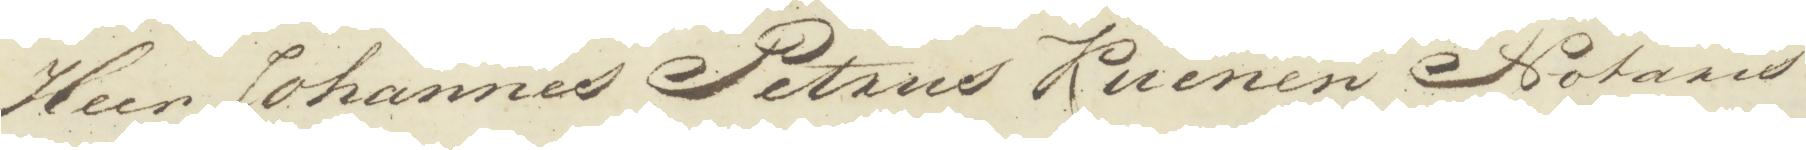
Heer Johannes Petrus Kuenen Notaris
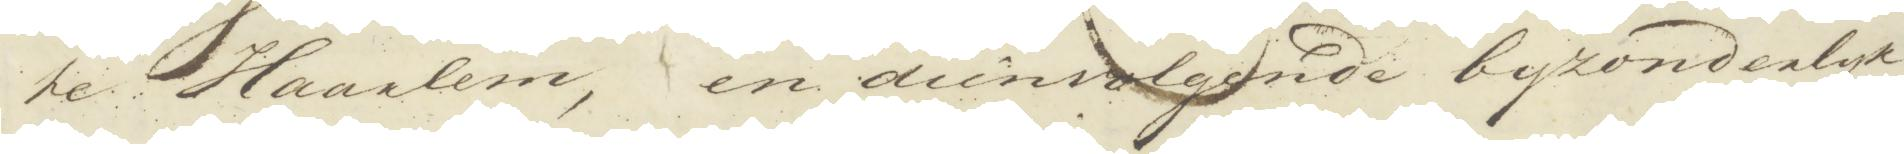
te Haarlem, en dienvolgende byzonderlyk
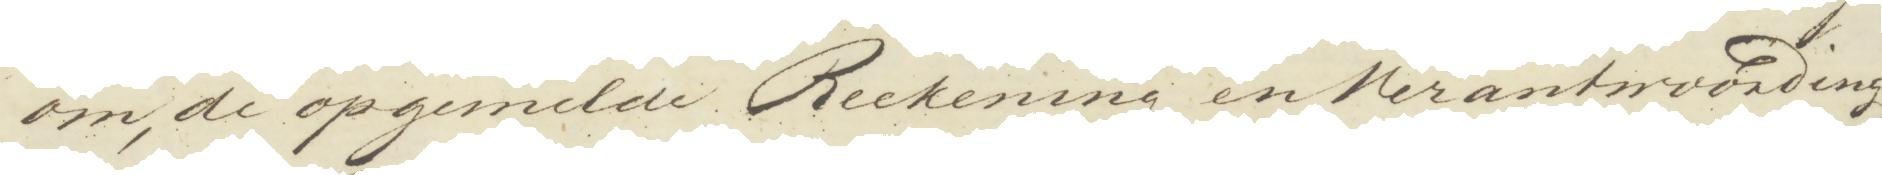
om, de opgemelde Reekening en verantwoording
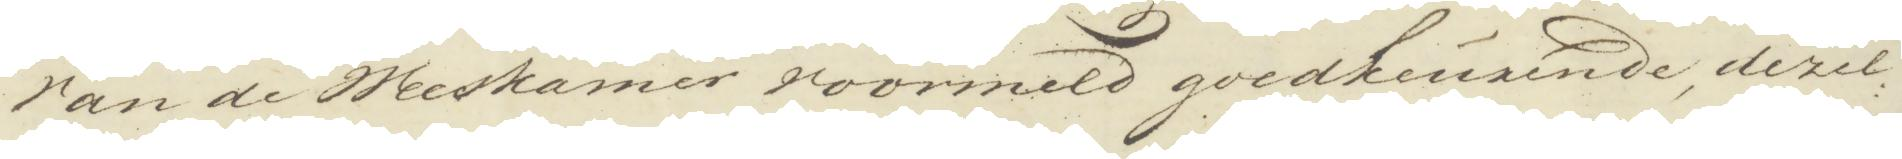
van de Weeskamer voormeld goedkeurende, dezel:
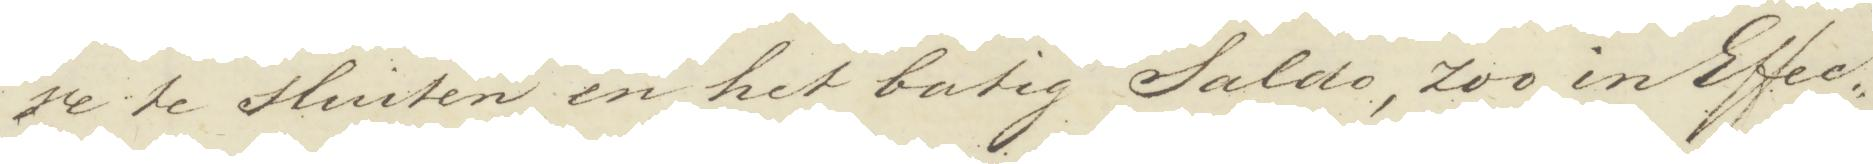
ve te sluiten en het batig Saldo, zoo in Effec„
